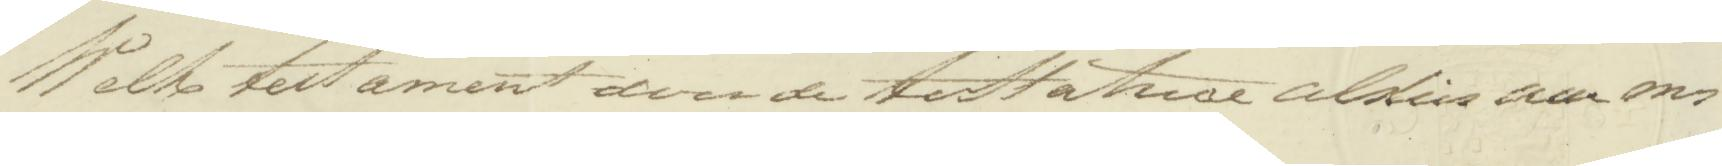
Welk testament door de testatrice aldus aan my
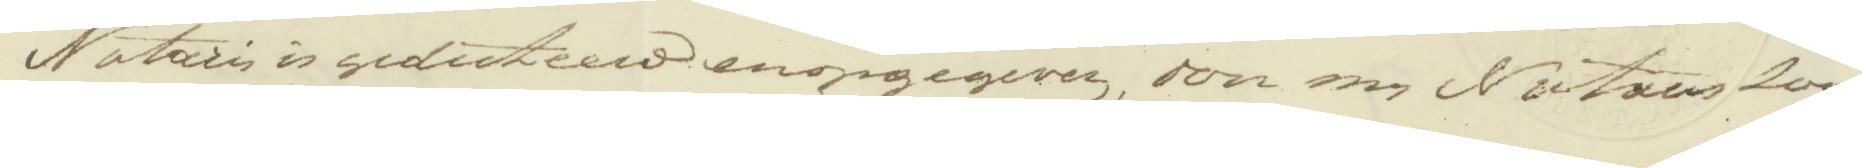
Notaris is gedicteerd en opgegeven, door my Notaris zoo
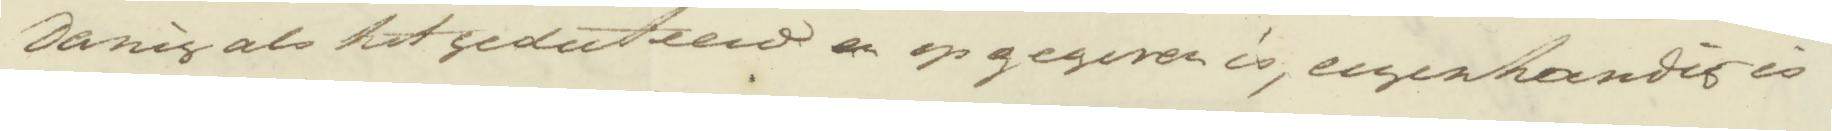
danig als het gedicteerd en opgegeven is, eigenhandig is
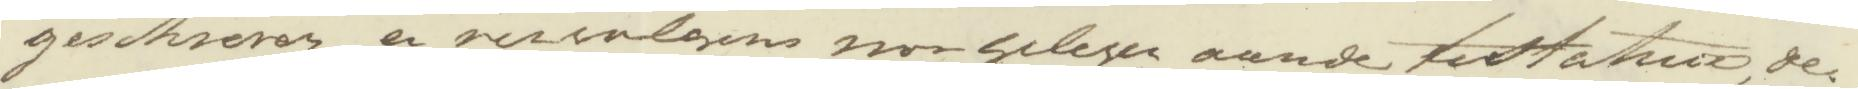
geschreven, en vervolgens voor gelezen aande testatrice, de„
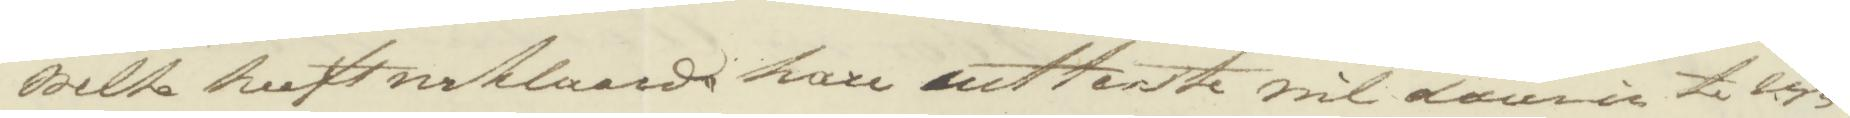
welke heeft verklaard hare uitterste wil daarin te zyn
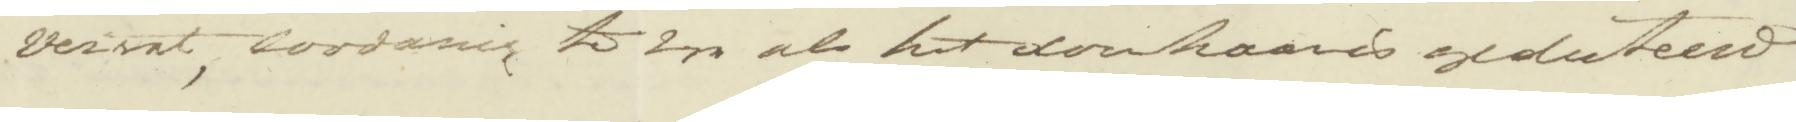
vervat, zoodanig te zyn als het door haar is gedicteerd
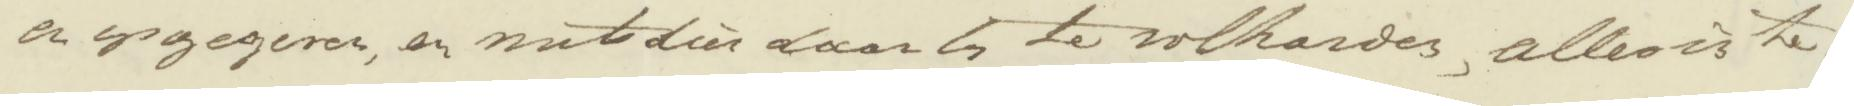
en opgegeven, en mitsdien daarby te volharden, alles in te
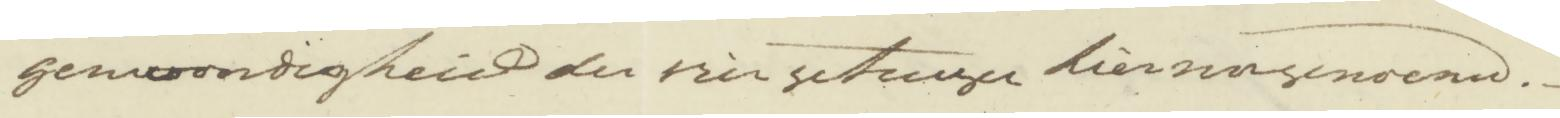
genwoordigheid der vier getuigen hierna genoemd.
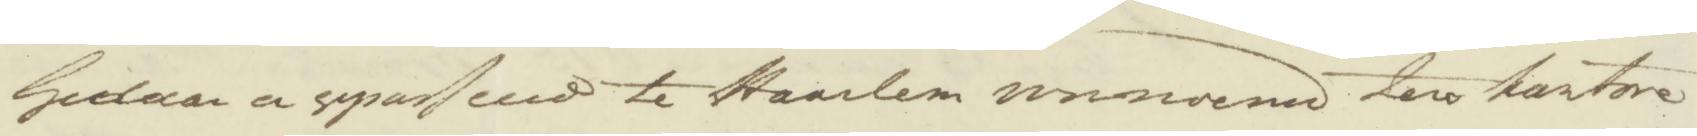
Gedaan en gepasseerd te Haarlem voornoemd ten kantore
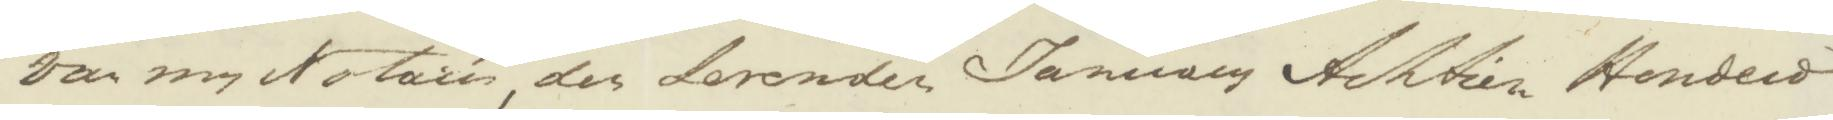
van my Notaris, den Zevenden January Achtien Honderd
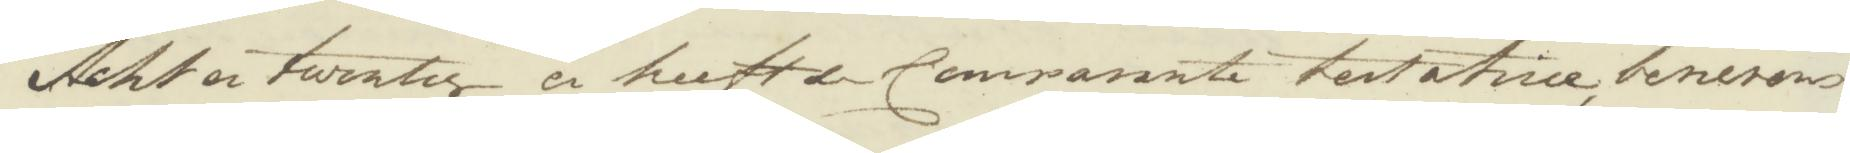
Acht en twintig, en heeft de Comparante testatrice, benevens
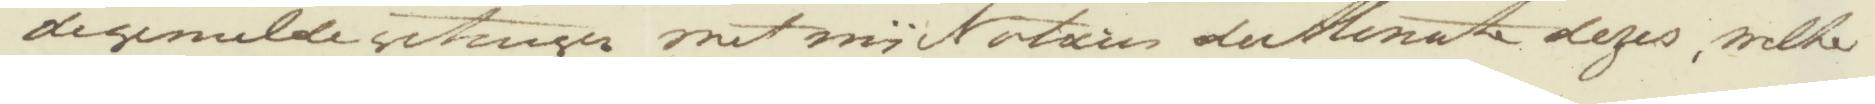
de gemelde getuigen met mij Notaris de Minute dezes, welke
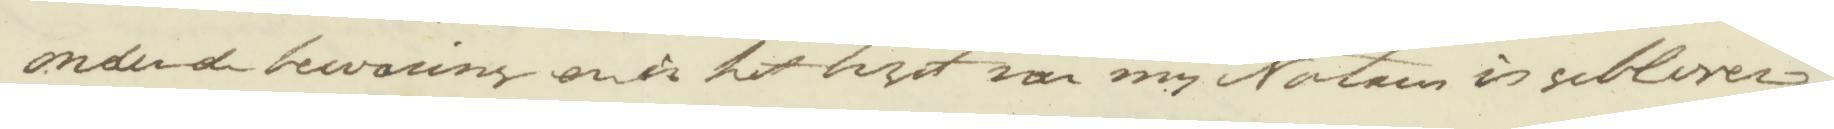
onder de bewaring en in het bezit van my Notaris is gebleven
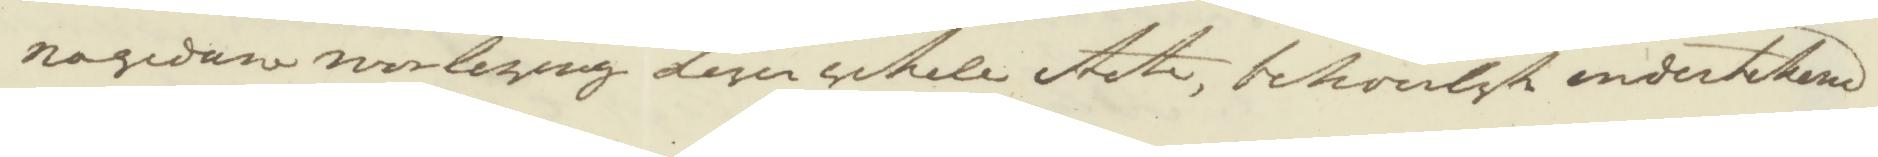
nagedane voorlezing dezer gehele Acte, behoorlyk ondertekend
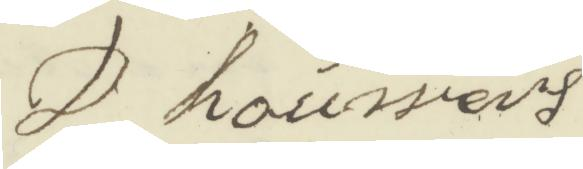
D houwers
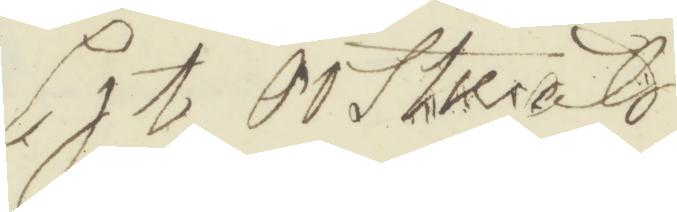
C J T Oostwald
